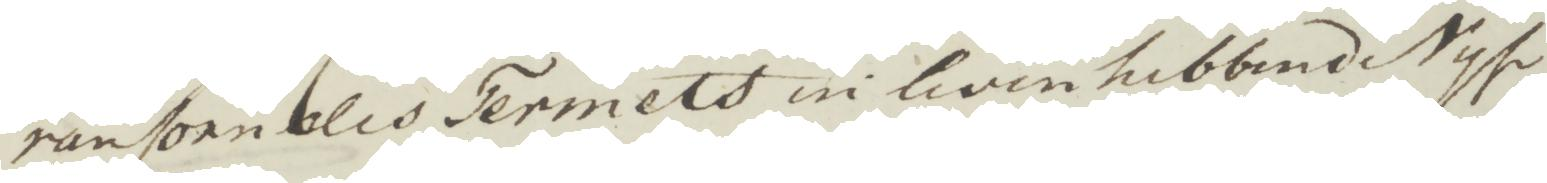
van Cornelis Termets in leven hebbende Vyf
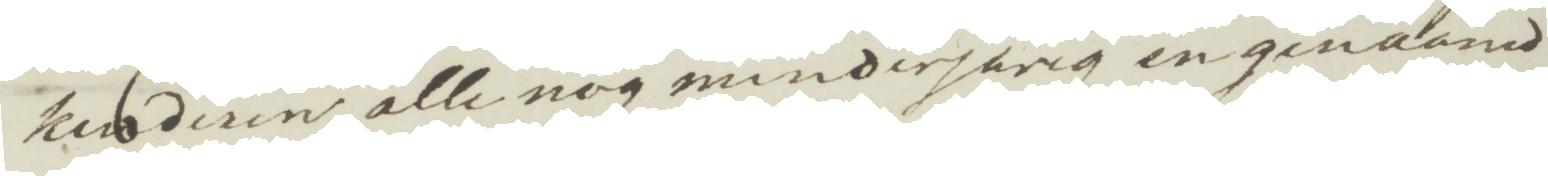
kinderen alle nog minderjarig en genaamd
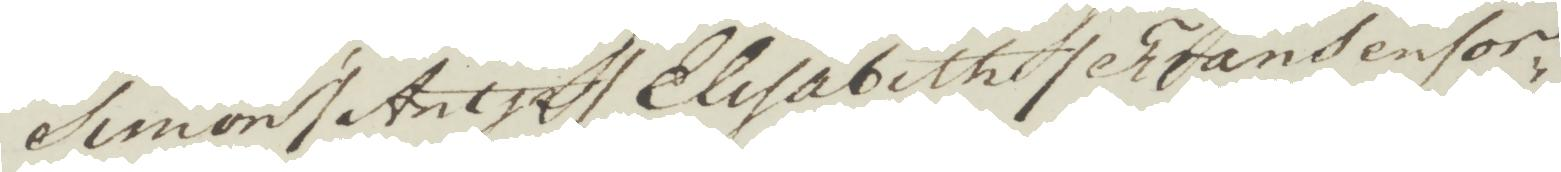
Simon / Antje / Elisabeth / Frans en Cor„
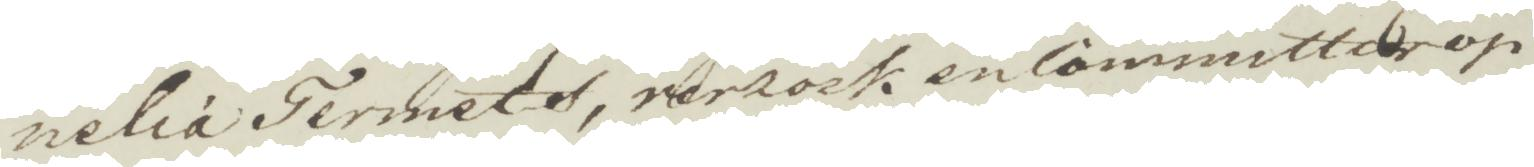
nelia Termets, verzoek en committeer op
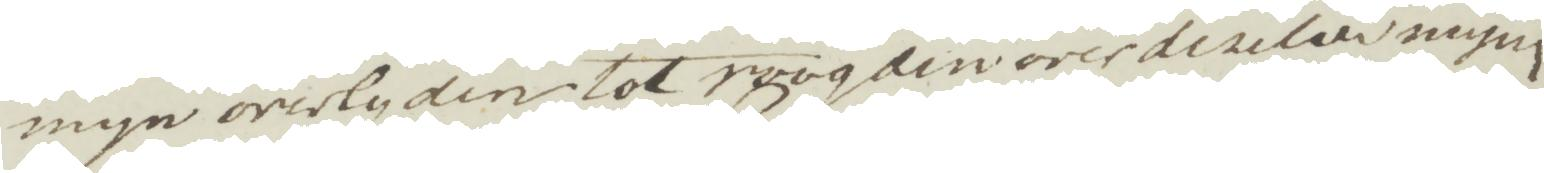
myn overlyden tot voogden over dezelve myn
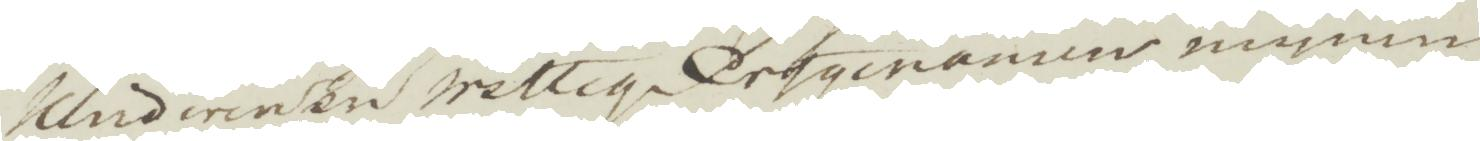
kinderen en wettige Erfgenamen myne
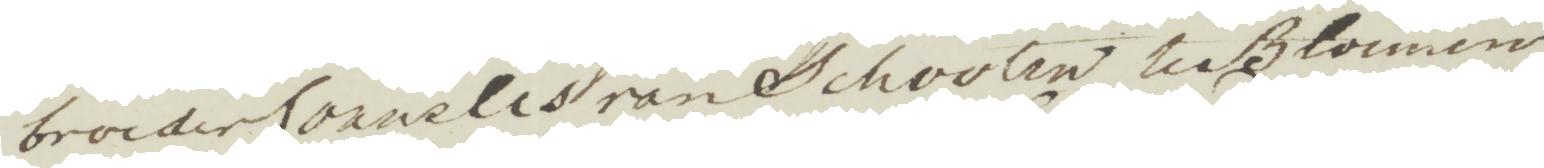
broeder Cornelis van Schooten te Bloemen
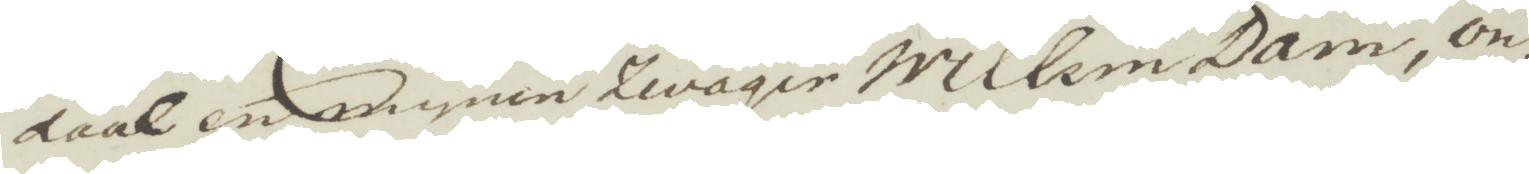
daal en mynen zwager Willem Dam, on
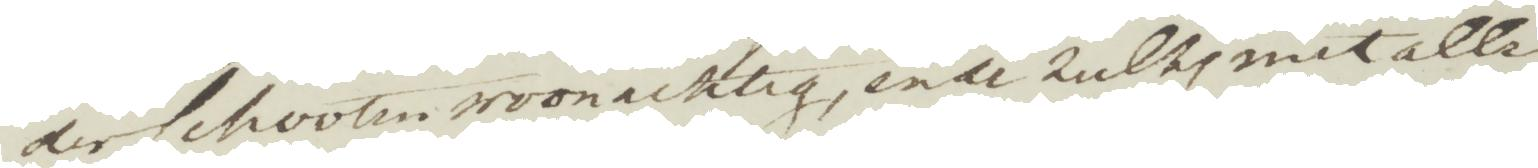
der Schooten woonachtig, ende zulks met alle
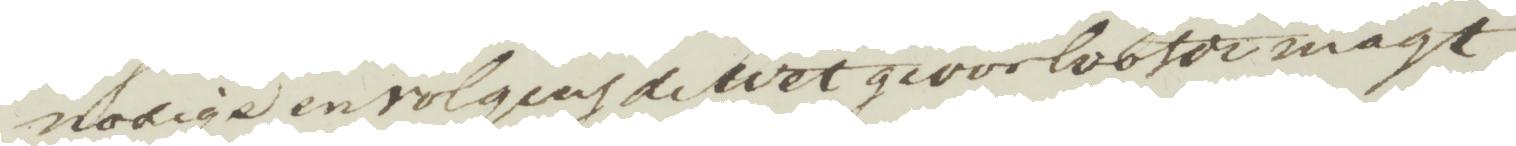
nodige en volgens de wet geoorloofde magt
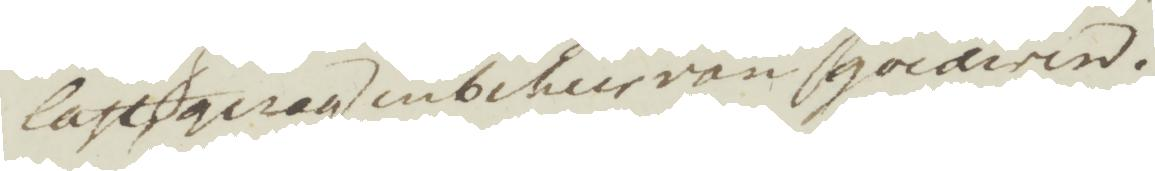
last, gezag in beheer van goederen.
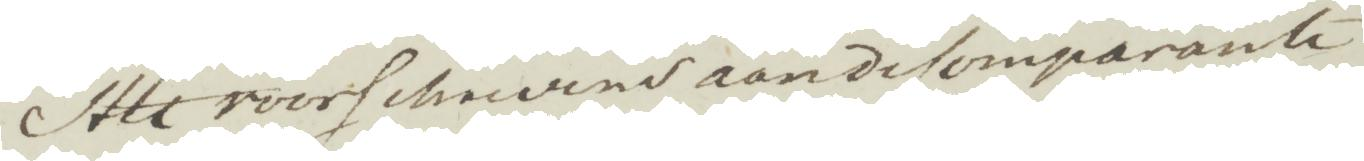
Het voorschrevene aan de Comparante
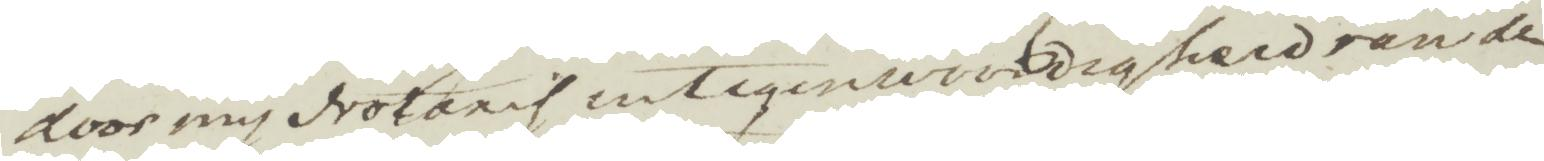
door my Notaris integenwoordigheid van de
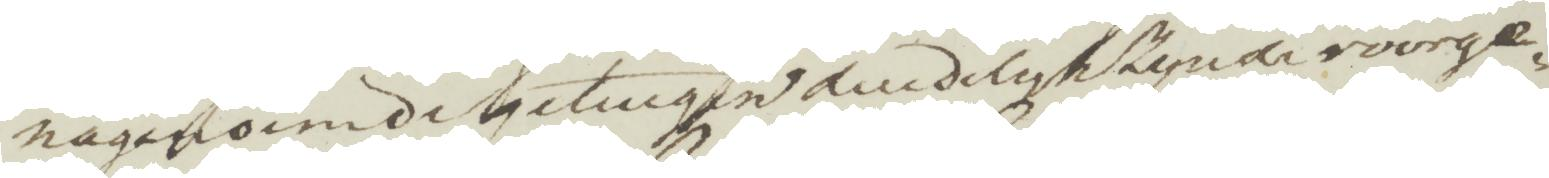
nagenoemde Getuigen duidelyk zynde voorge„
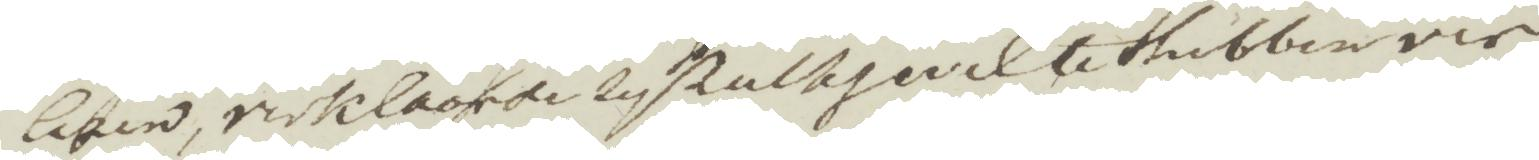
lezen, verklaarde zy Zulks wel te hebben ver
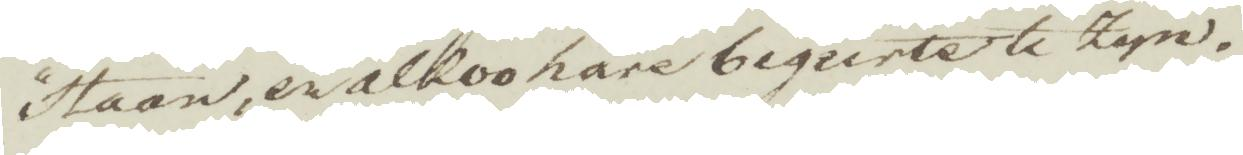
staan, en alzoo hare begeerte te Zyn,
